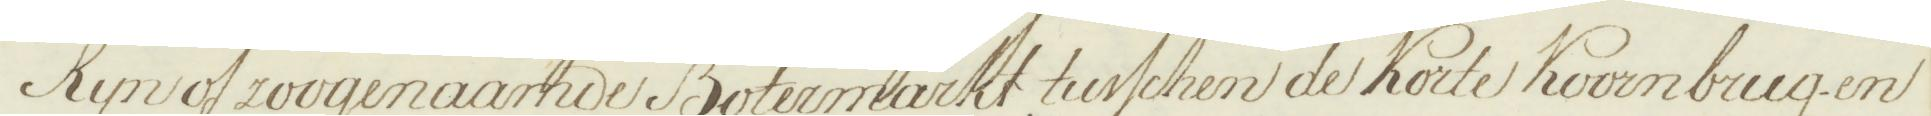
Ryn of zoogenaamde Botermarkt, tusschen de Korte Koornbrug en
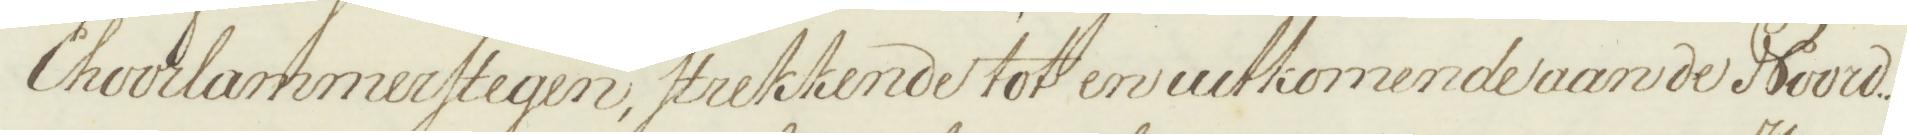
Choorlammerstegen, strekkende tot en uitkomende aan de Noord„
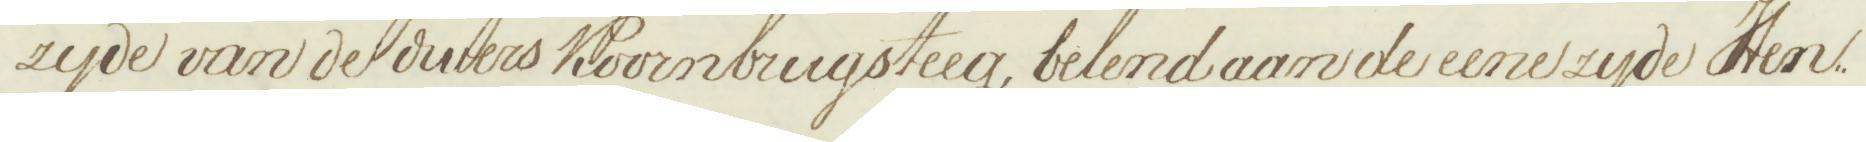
zyde van de dwers Koornbrugsteeg, belend aan de eene zyde Hen„
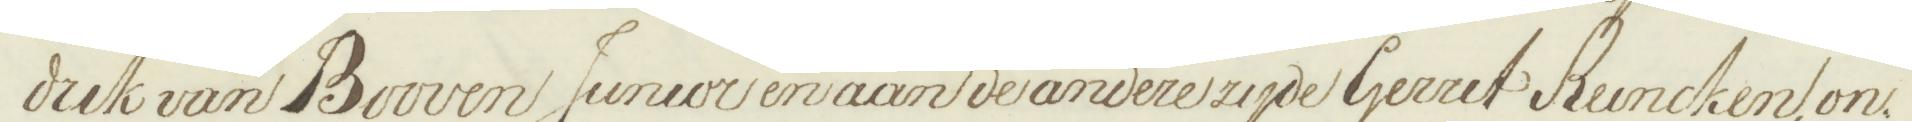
drik van Booven Junior en aan de andere zyde Gerrit Reincken, on„
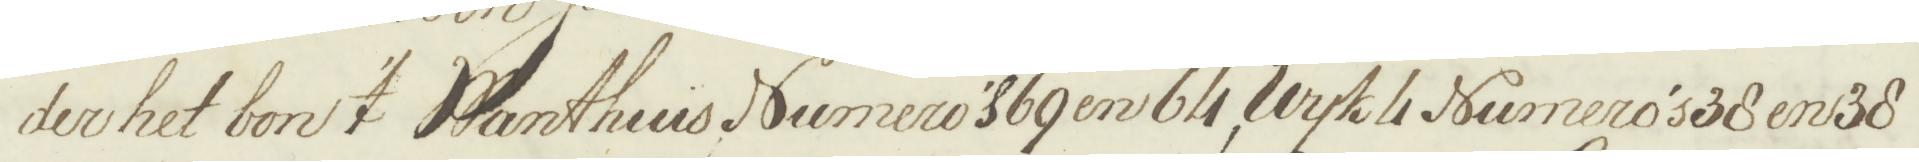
der het bon ’t Wanthuis, Numero's 69 en 64, wyk 4 Numero's 38 en 38
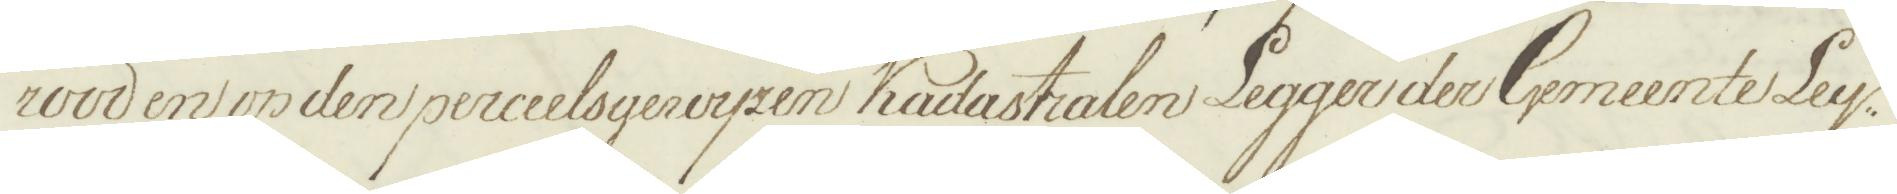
rood, en op den perceelsgewyzen Kadastralen Legger der Gemeente Ley„
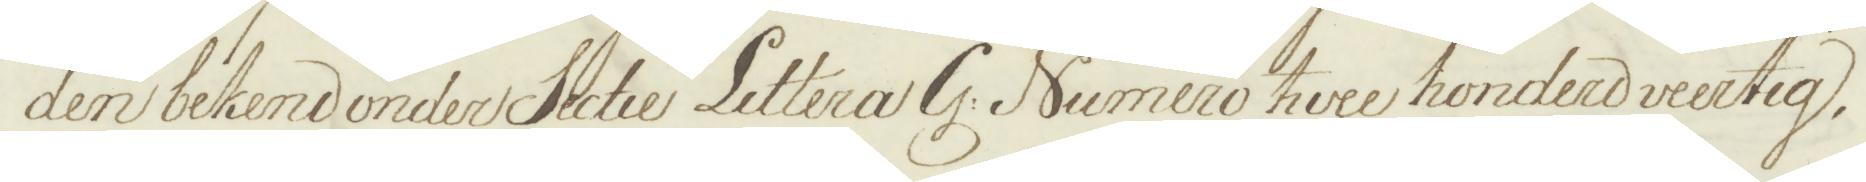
den bekend onder Sectie Littera G: Numero twee honderd veertig,
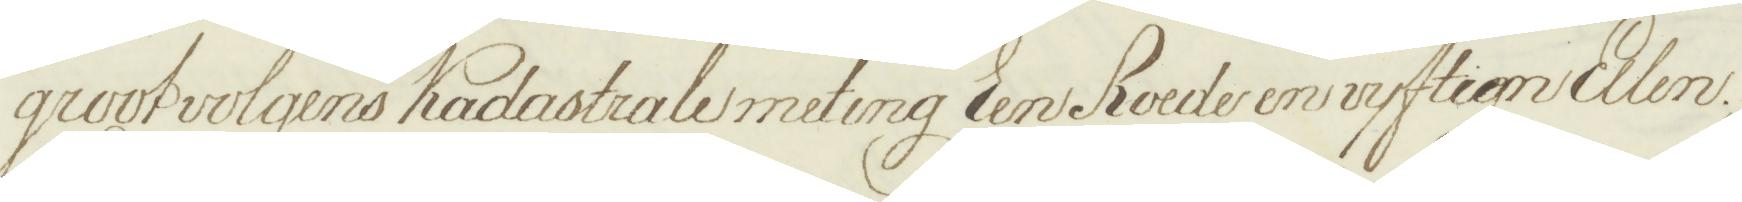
groot volgens Kadastrale meting Een Roede en vyftien Ellen.
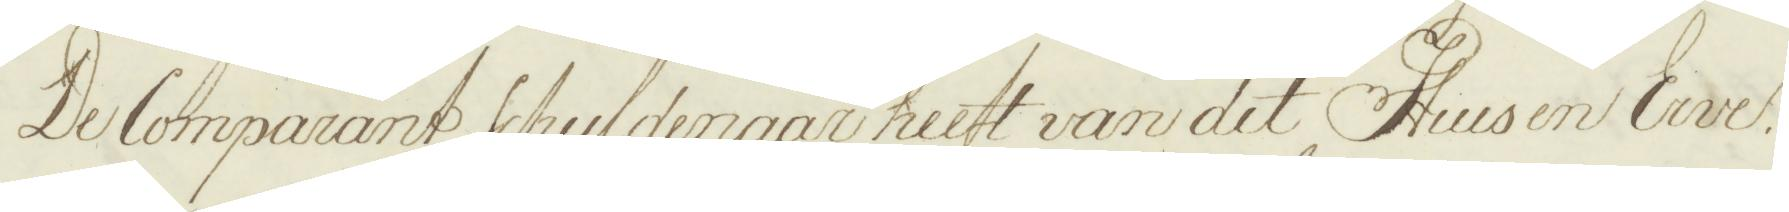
De Comparant schuldenaar heeft van dit Huis en Erve.
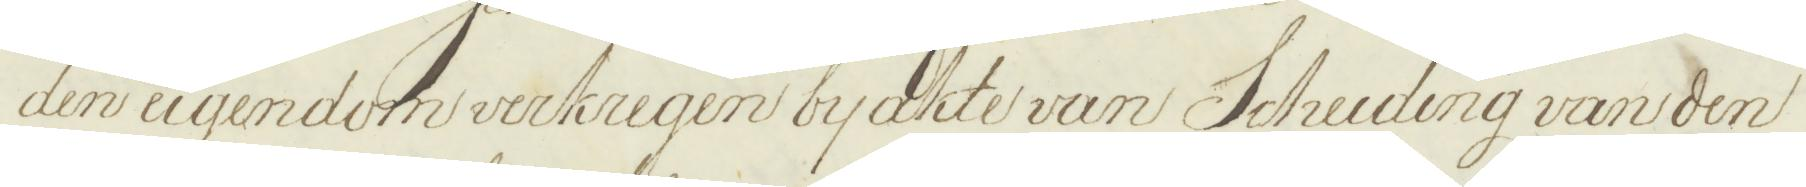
den eigendom verkregen by akte van Scheiding van den
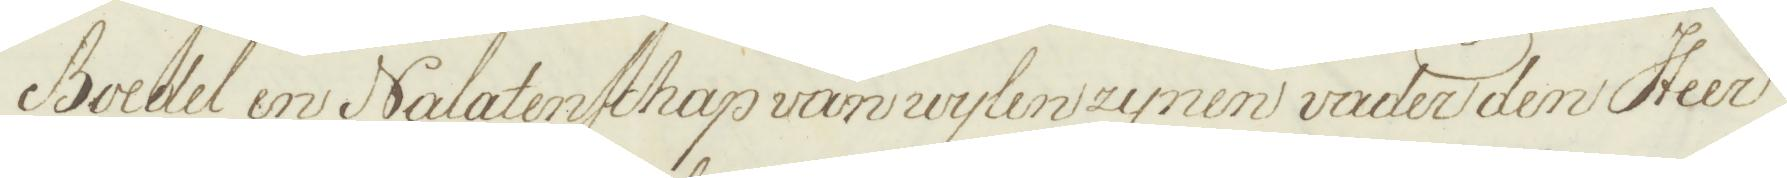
Boedel en Nalatenschap van wylen zynen vader den Heer
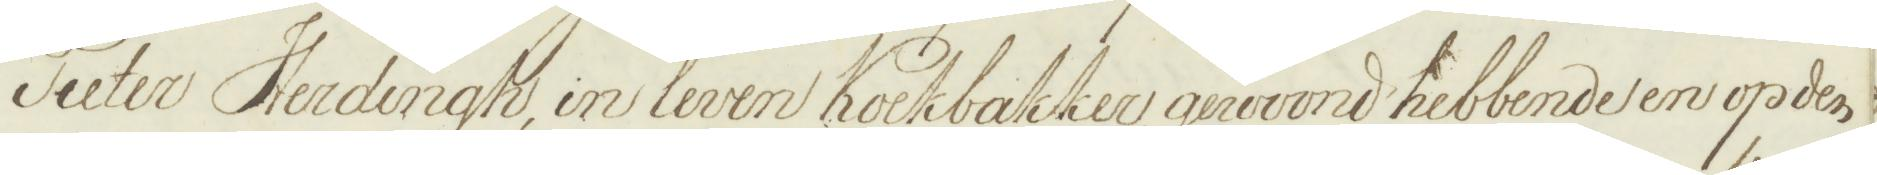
Pieter Herdingh, in leven Koekbakker, gewoond hebbende en op den
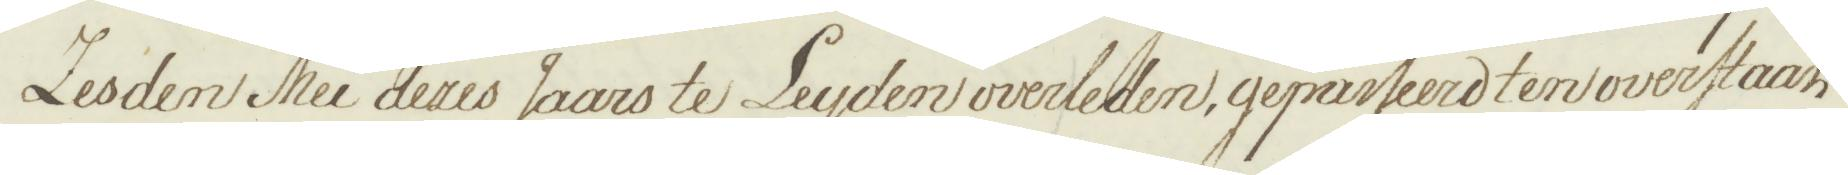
Zesden Mei dezes Jaars te Leyden overleden, gepasseerd ten overstaan
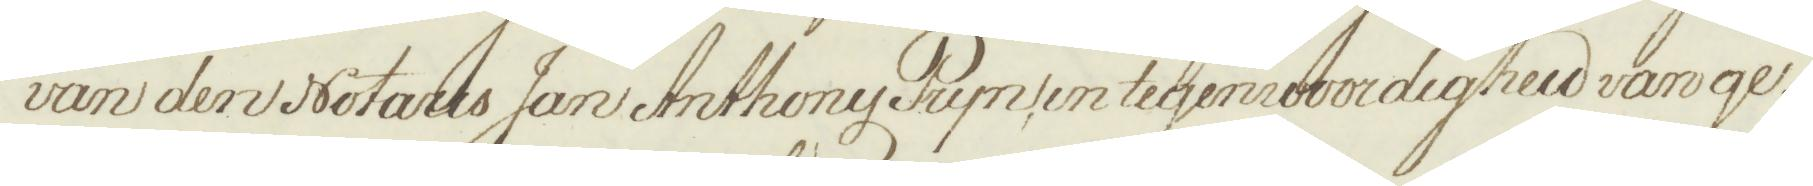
van den Notaris Jan Anthony Pryn, in tegenwoordigheid van ge„
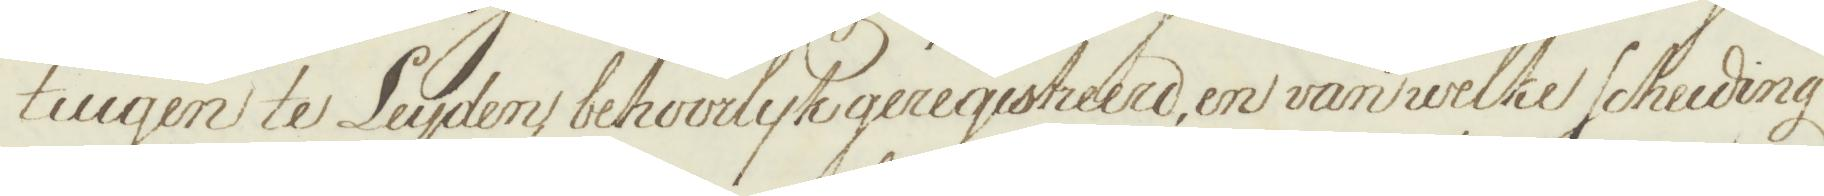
tuigen te Leyden, behoorlyk geregistreerd, en van welke scheiding
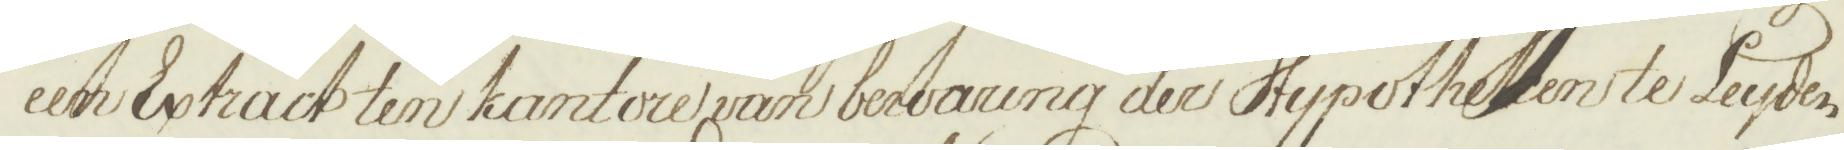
een Extract ten kantore van bewaring der Hypotheken te Leyden
